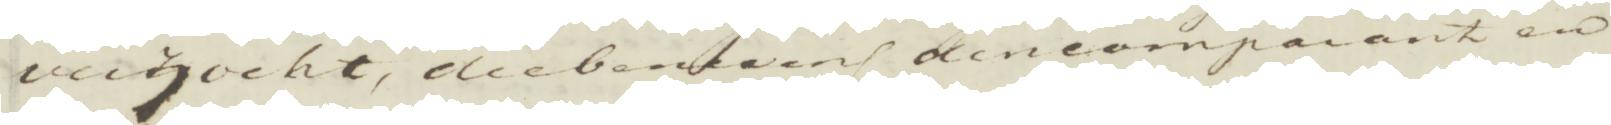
verzocht, die benevens den comparant en
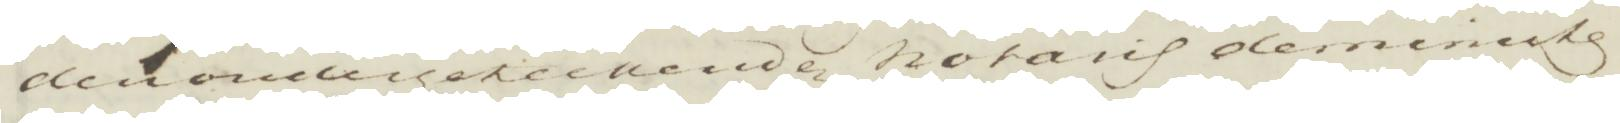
den ondergeteekenden notaris de minute
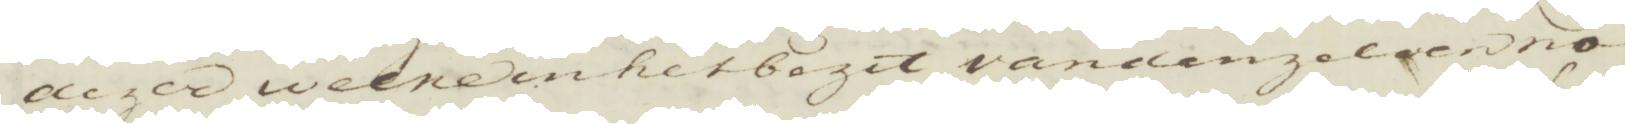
dezer welke in het bezit van denzelven no
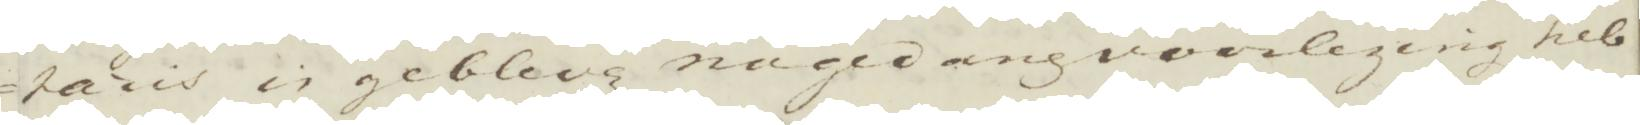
taris is gebleven na gedane voorlezing heb
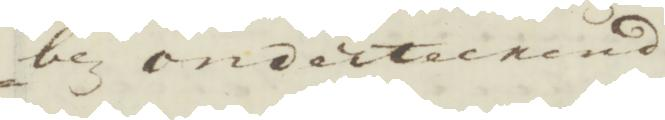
=ben onderteekend
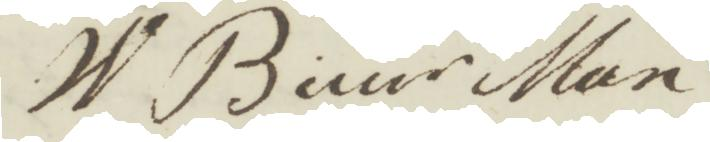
W Buur Man
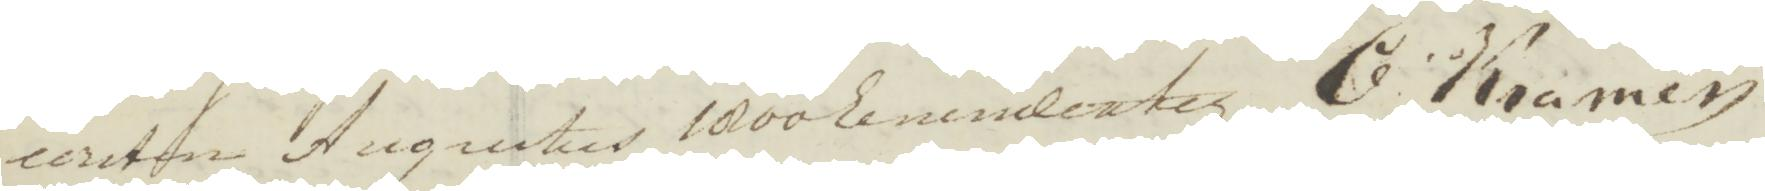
eersten Augustus 1800 Eenendertig C: Kramer
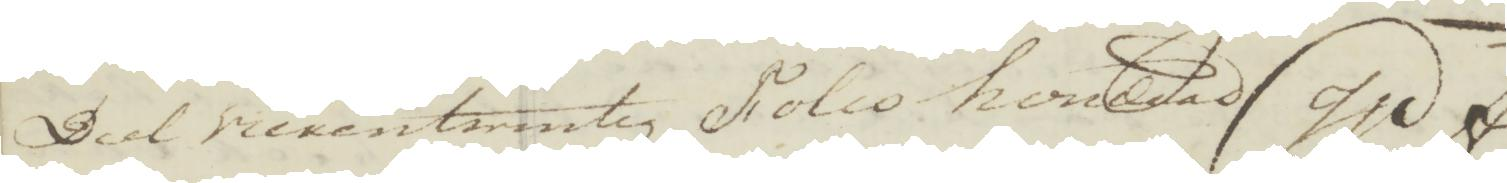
Deel vierentwintig folio honderd
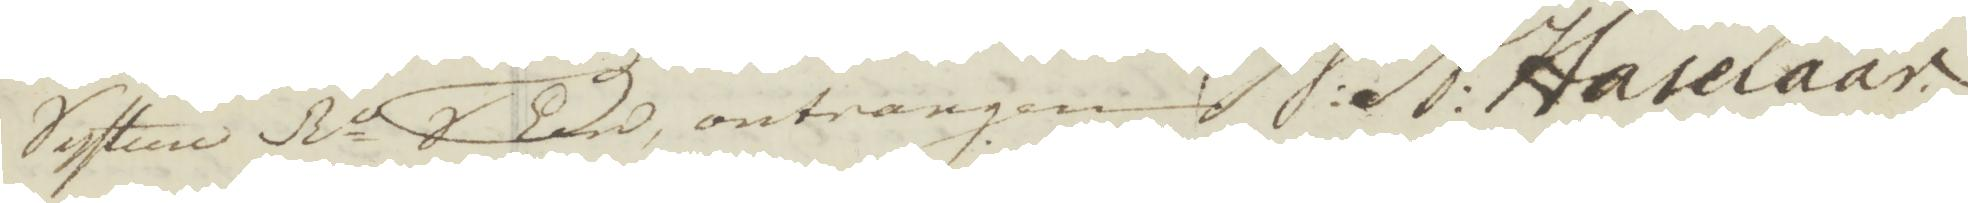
Vyftien R=o Een, ontvangen W:A: Haselaar.
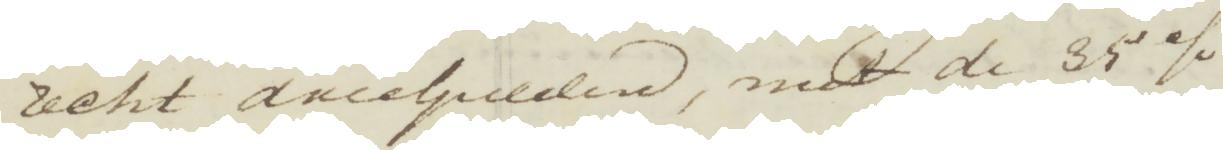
recht drie Gulden, met de 35%
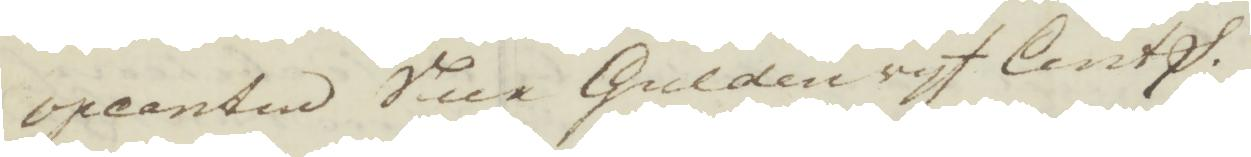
opcenten Vier Gulden vyf Cents.
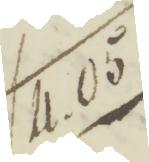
4.05
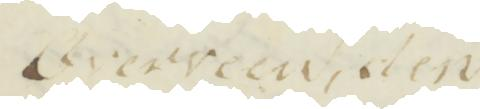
Overveen, den
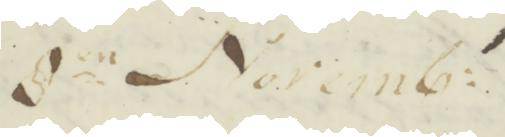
5=ste Novemb:
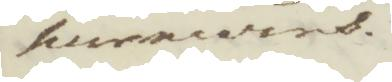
hiernevens.
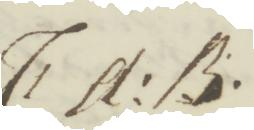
J: d: B:
